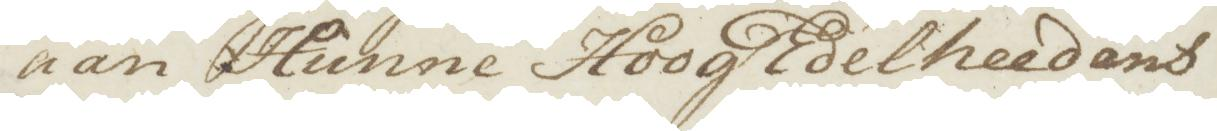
aan Hunne Hoog Edelheedens
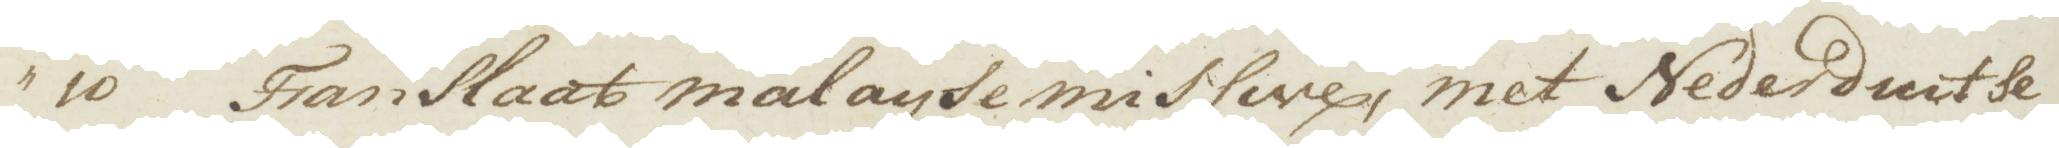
„ 10 Translaat malayse missive, met Nederduitse
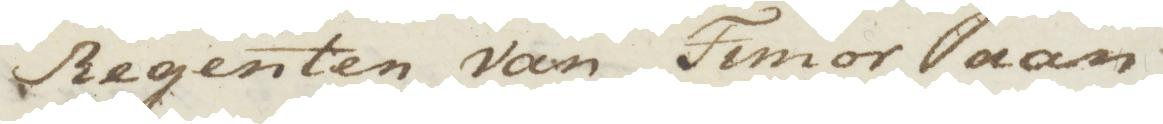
Regenten van Timor aan
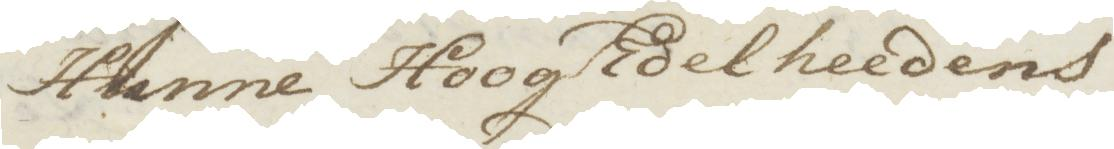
Hunne Hoog Edelheedens
